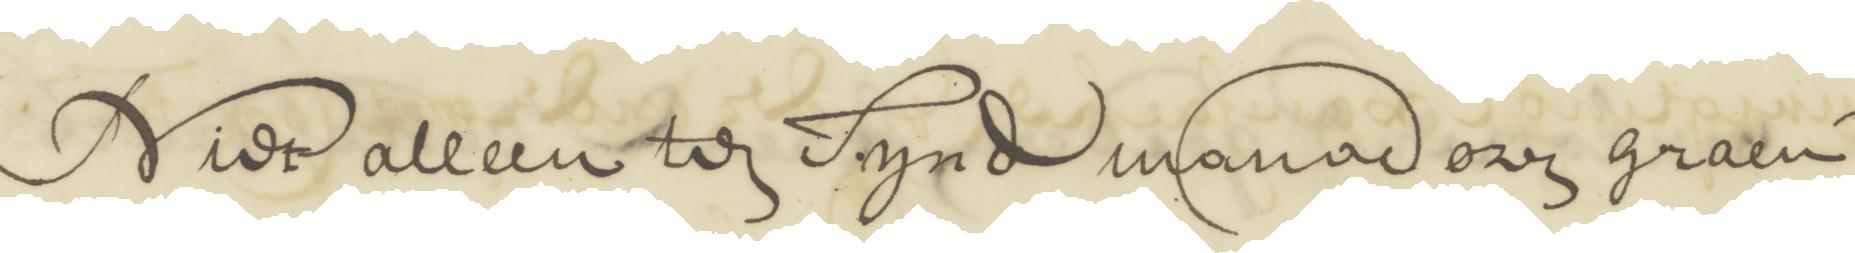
Niet alleen ten Eynde manedozen graen
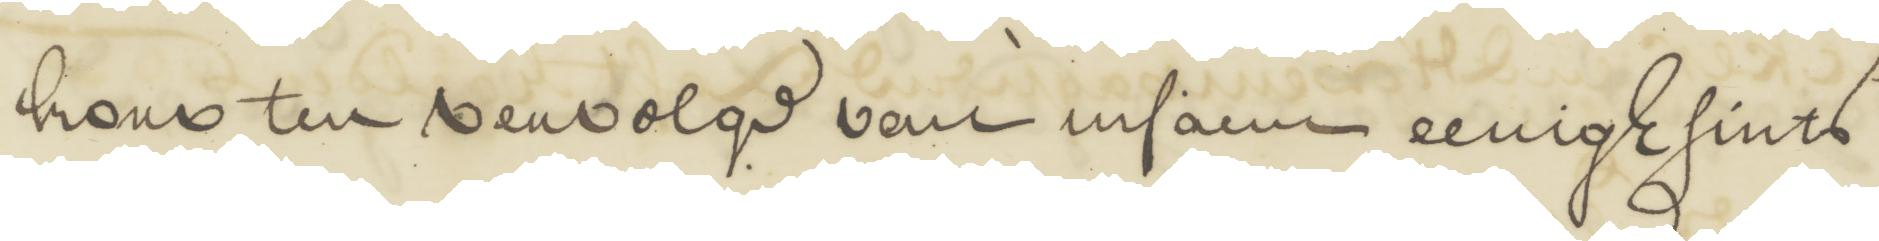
korv ten vervolge vant insaem eenigh sints
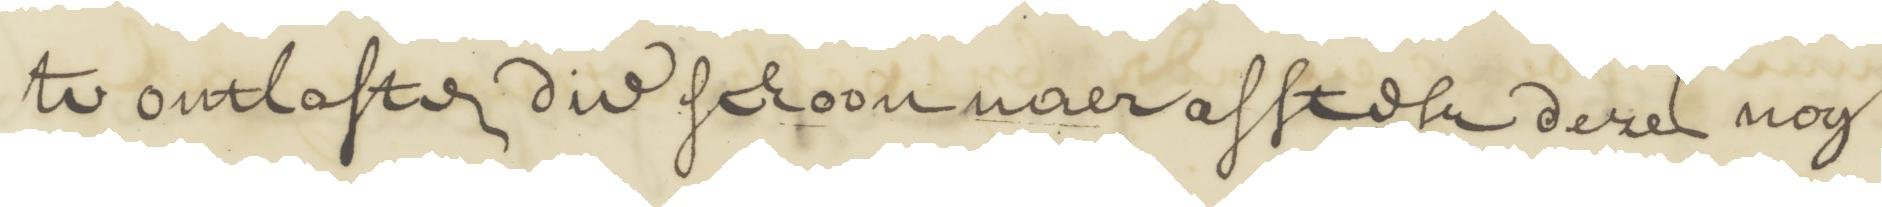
te ontlasten die schoon naer afstek dezes nog
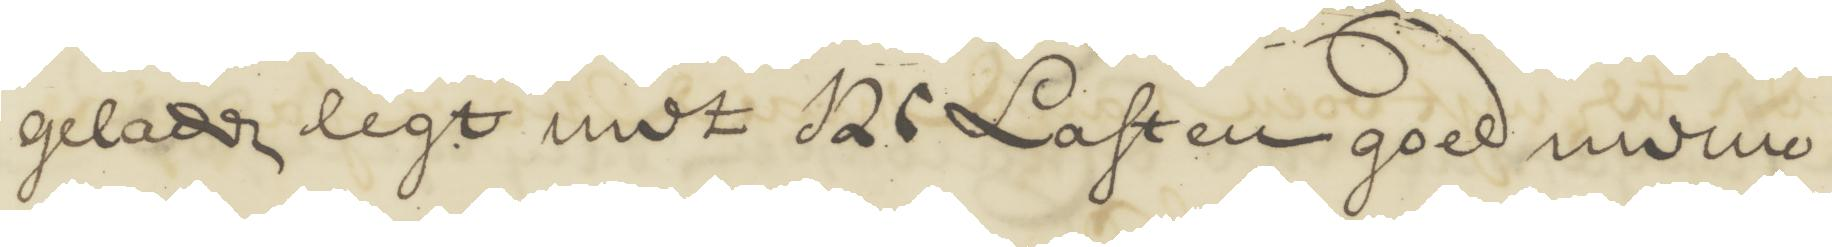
geladen legt met 125 Lasten goed nieuw
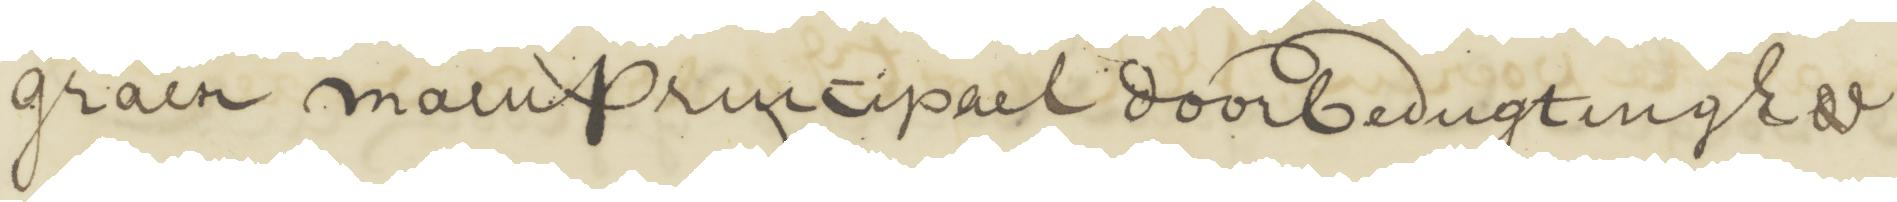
graen maer principael door bedugtingh de
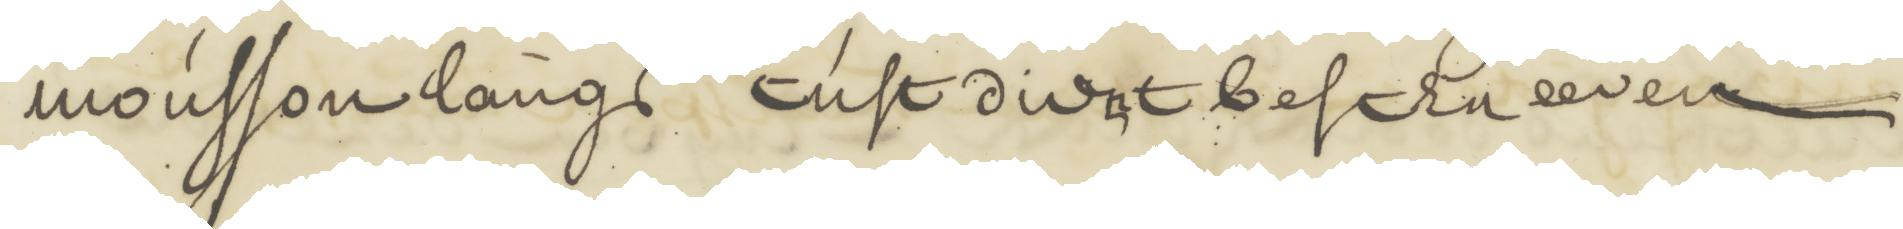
mousson langs cust dient beschreeven
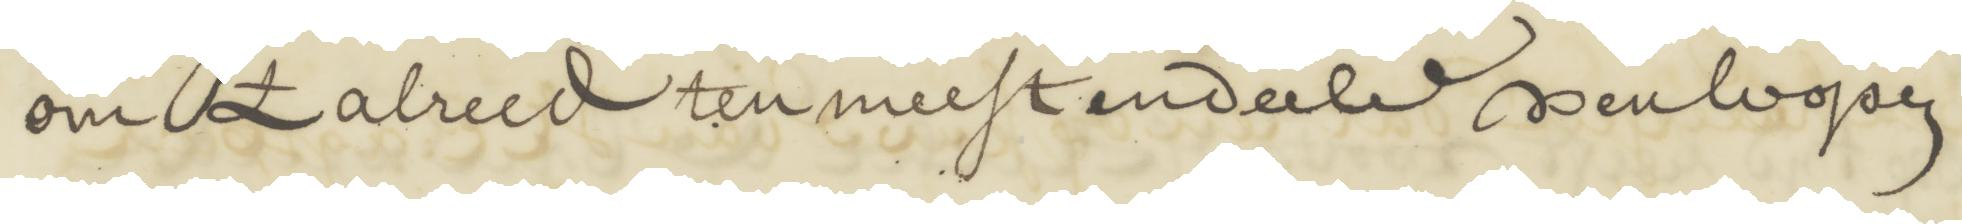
om t alreed ten meestendeele verloopen
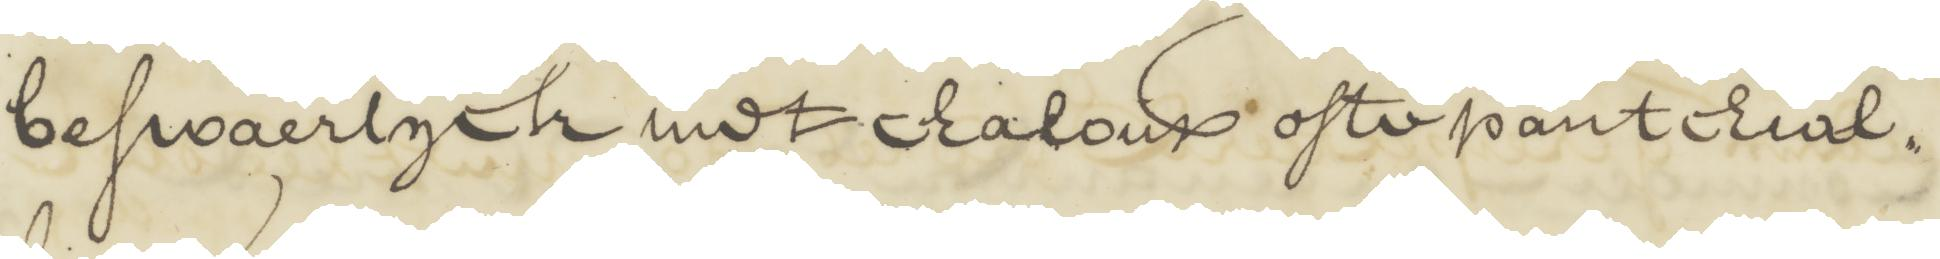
beswaerlyck met chaloup ofte pantchial„
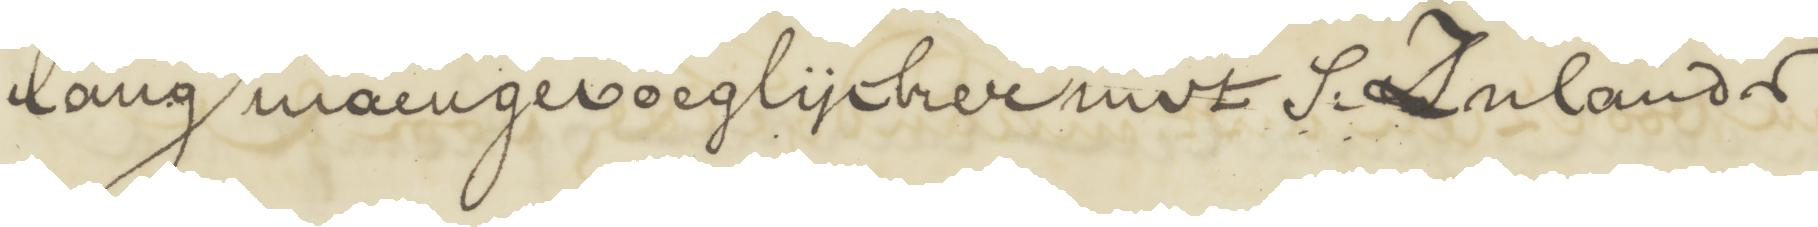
lang maer gevoeglijcker met s: Inlands
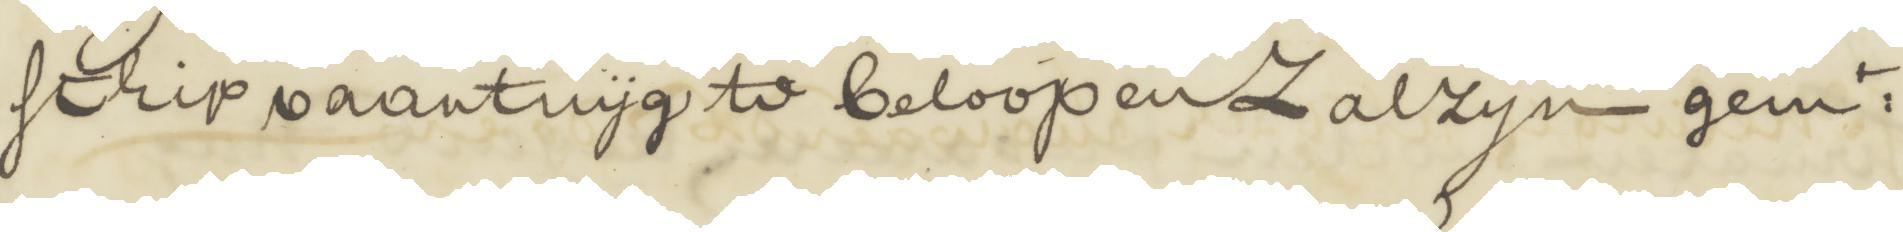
schip vaartuijg te beloopen zal zyn gem:t
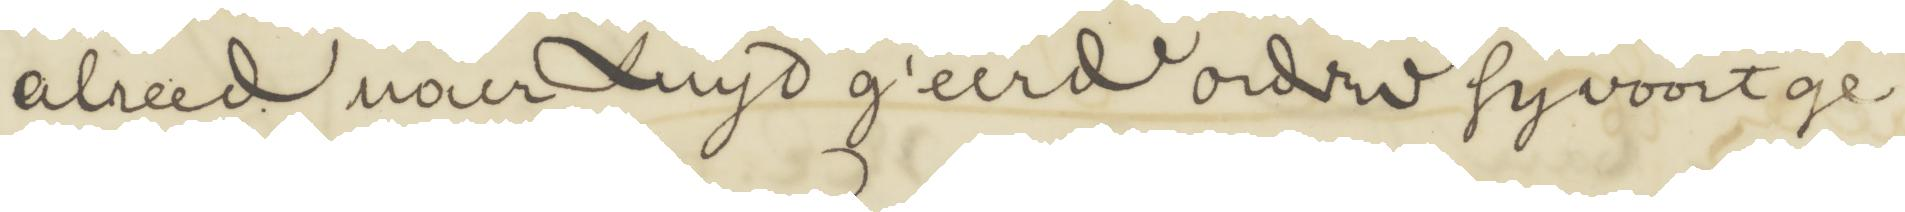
alreed naer zuyd g’eerde ordere sy voort ge
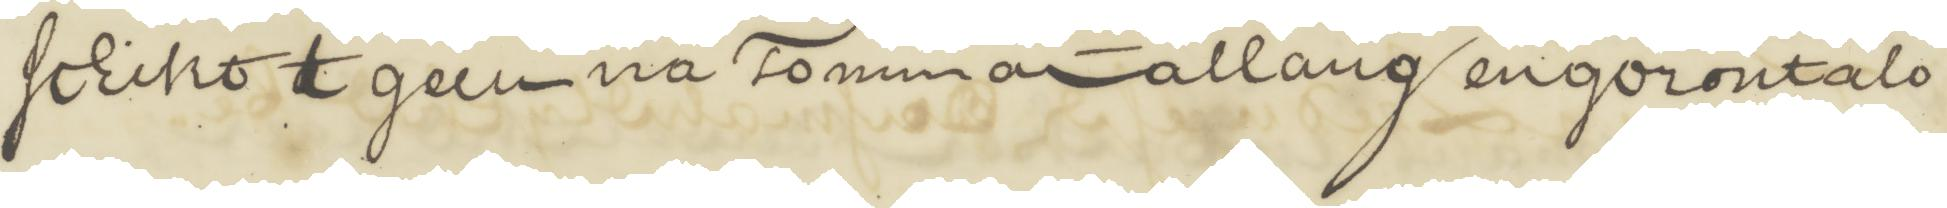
schikt t geen na Tommacallang en gorontalo
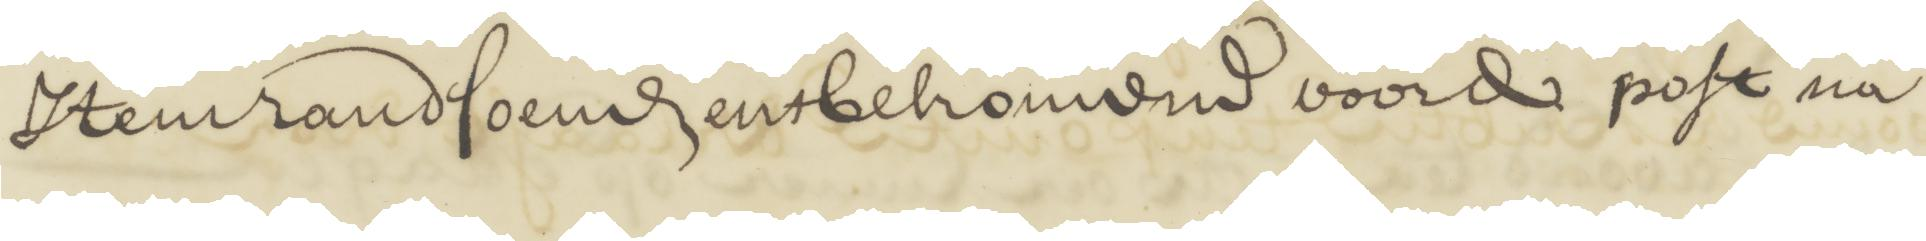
Item randsoenen ent bekomene voor de post na
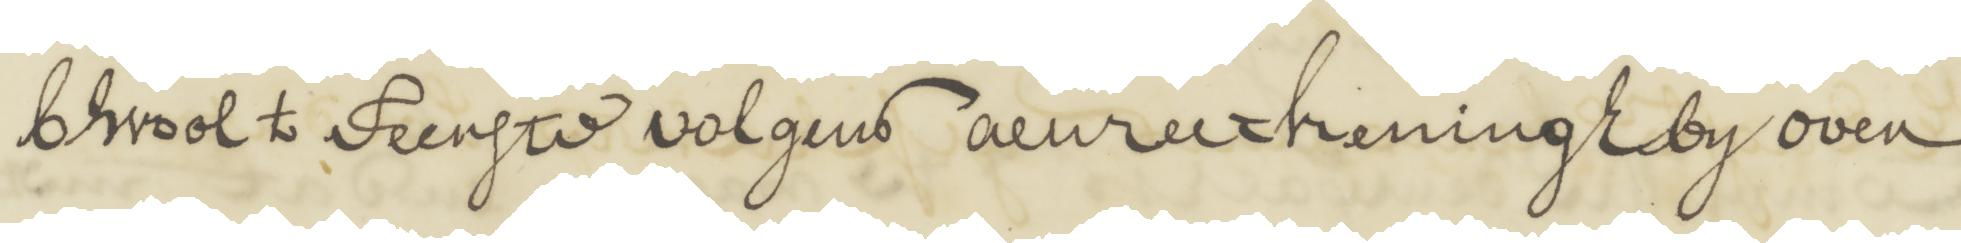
bwool t Eeerste volgens aenreeckeningh by over
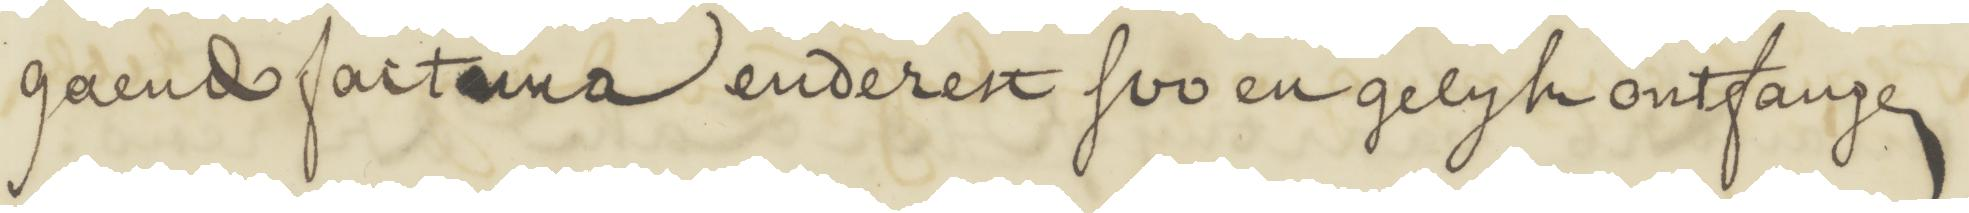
gaende factura en de rest soo en gelyk ontfangen
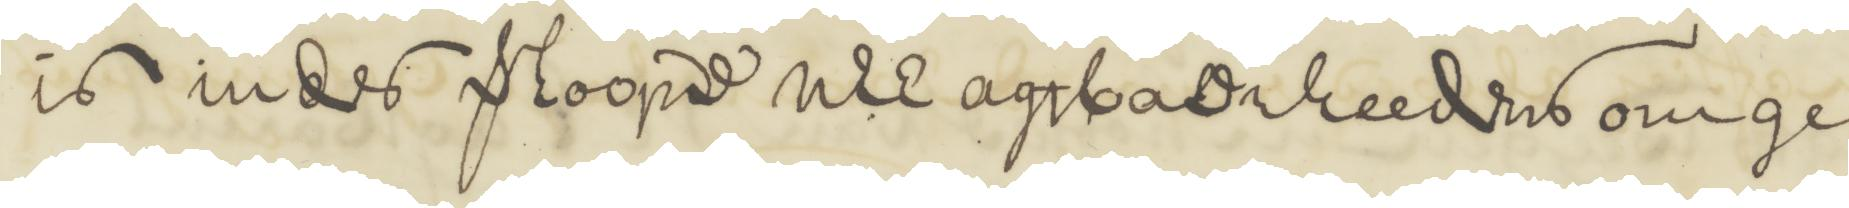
is in des verhoopde uEE agtbaerheedens om ge
